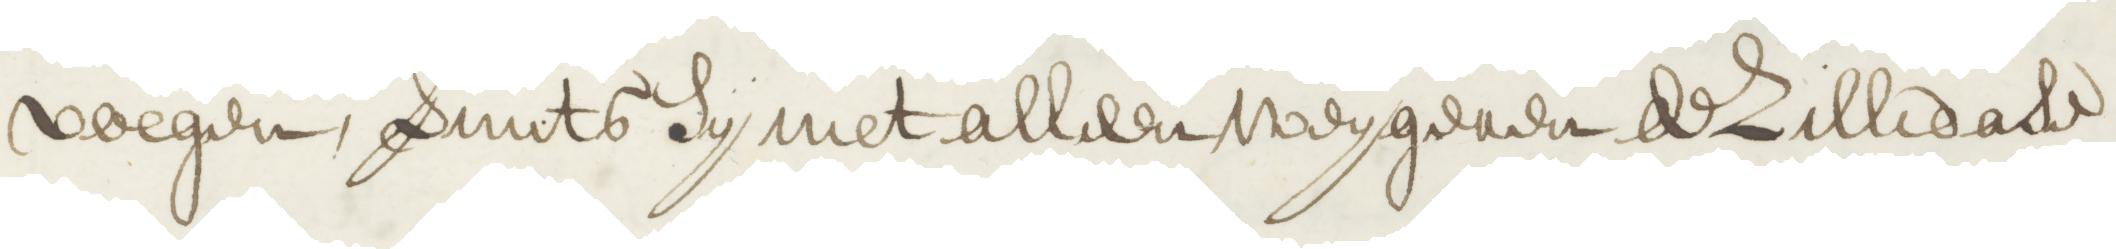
voegen, vermits sij niet alleen weijgeren de Zillidase
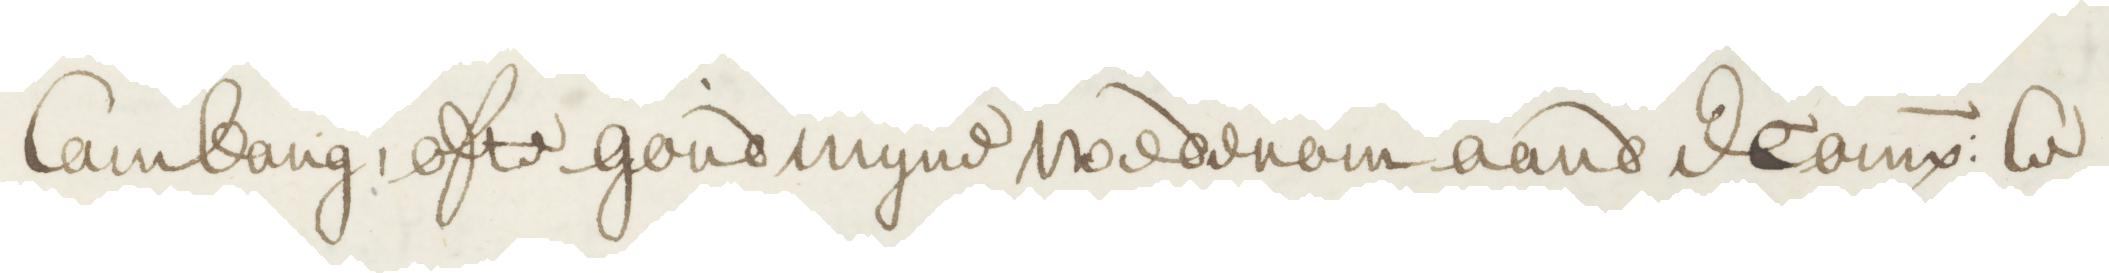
tambang, ofte goud mijne wederom aand’ E comp: te
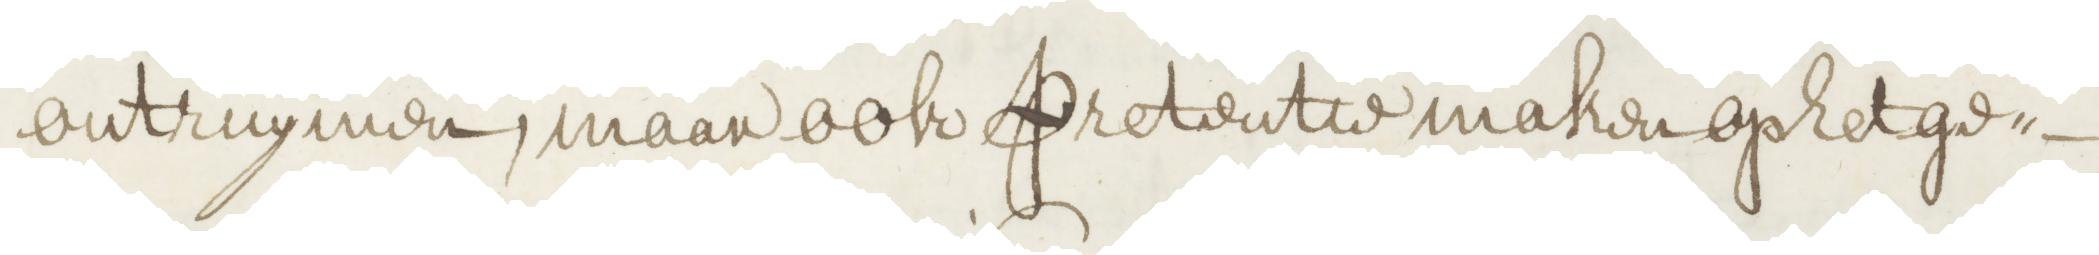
ontruijmen, maar ook pretentie maken ophetge„
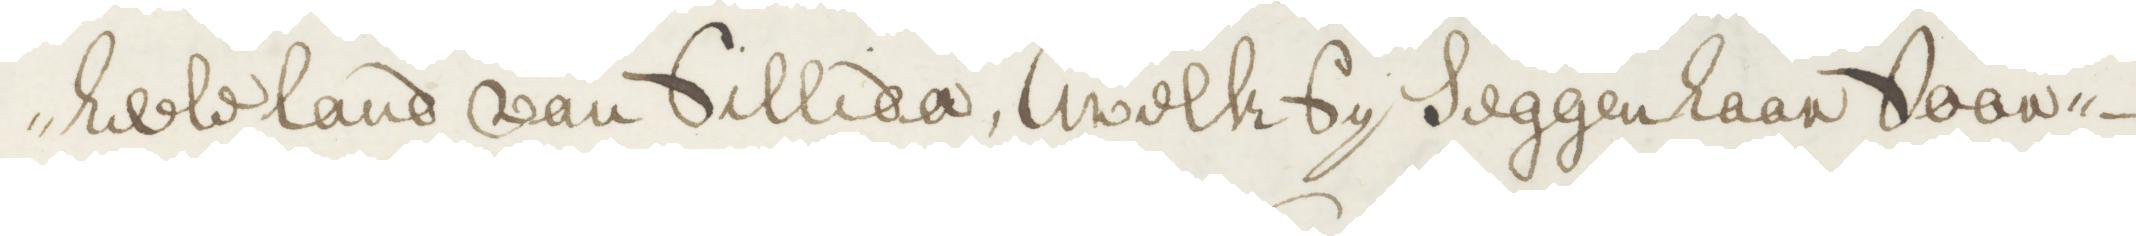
heele land van Sillida, 'twelk bij seggen haar voor„
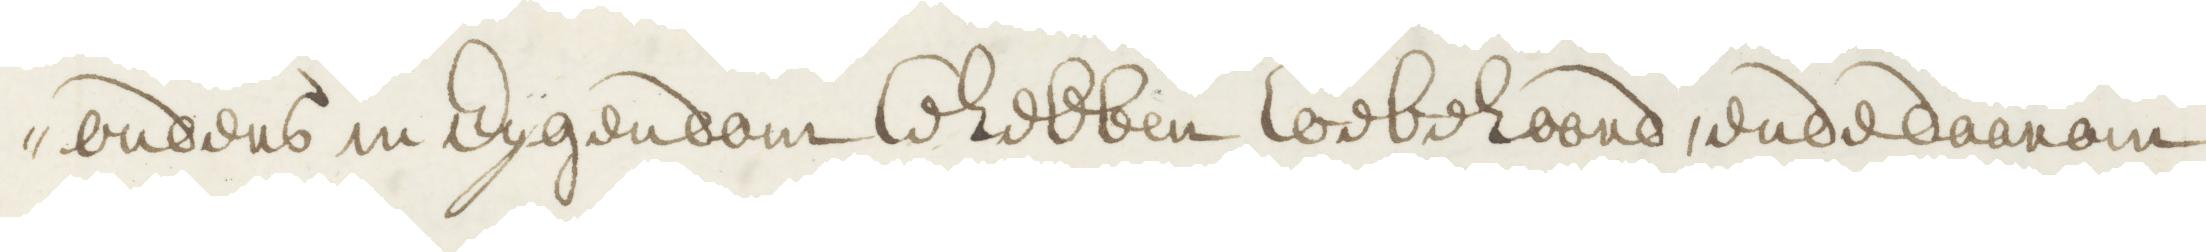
ouders in Eijgendom te hebben toebehoord, ende daarom
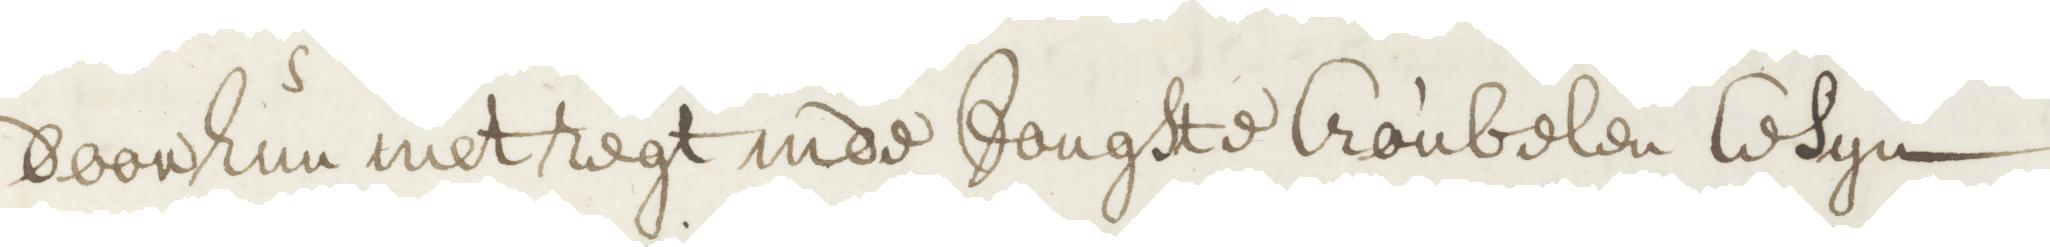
door hun met regt inde Iongste troubelen te sijn
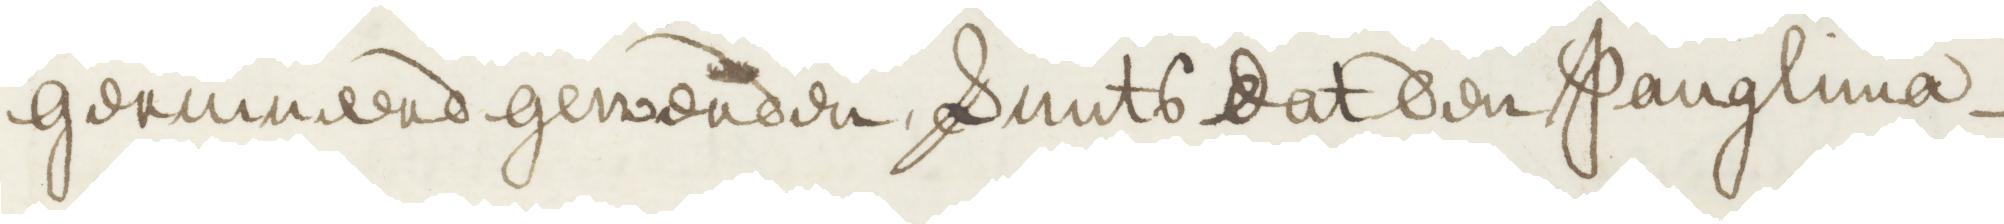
geruineerd gewerden, vermits dat den Panglima
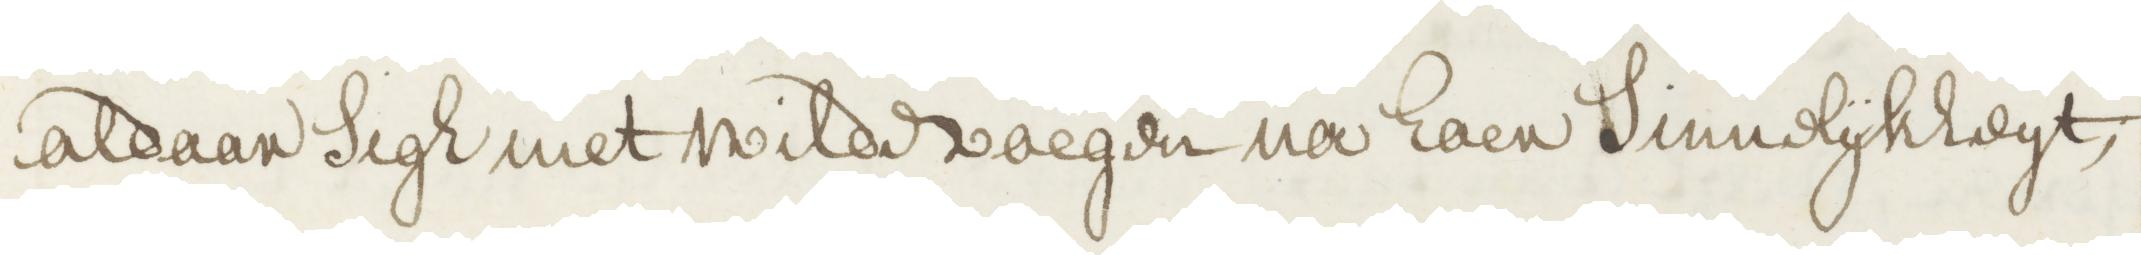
aldaar sigh niet wilde voegen na haer sinnelijkheijt;
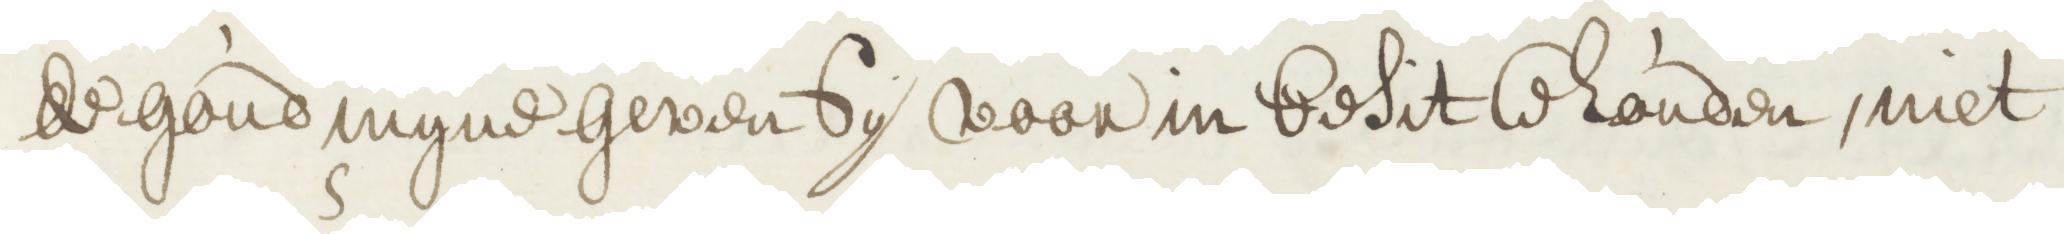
de goud mijne geven sij voor in besit tehouden, niet
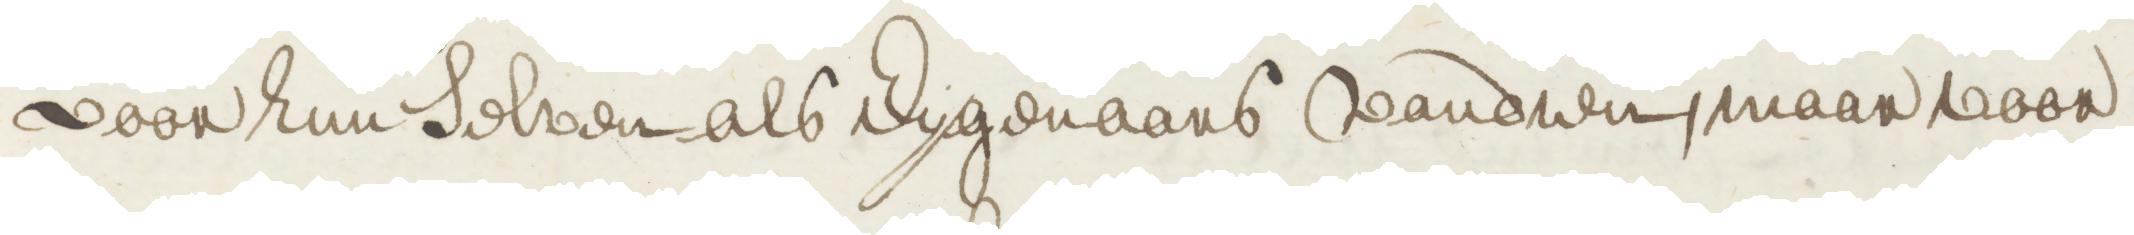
voor hun selven als Eijgenaars vandien, maar voor
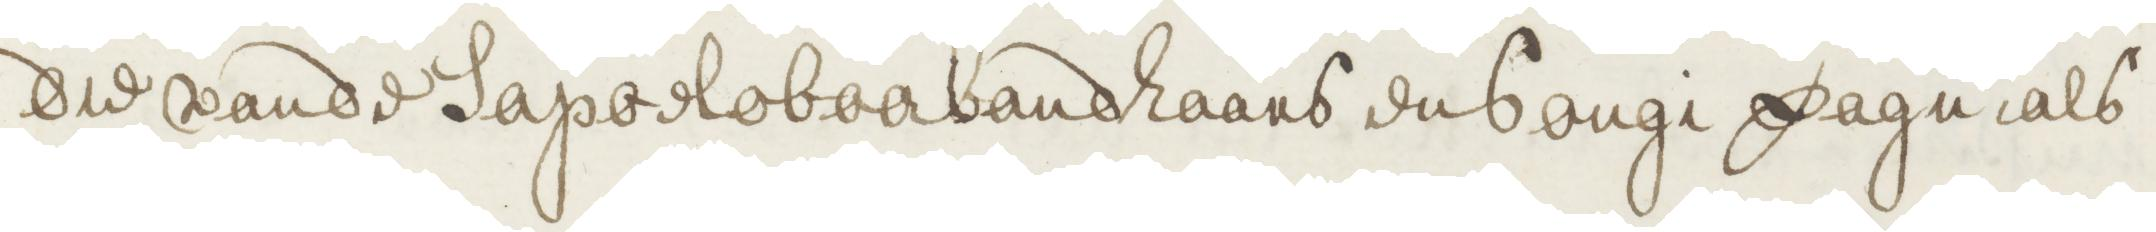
die van de Sapoeloboabandhaars en Songi xagu als
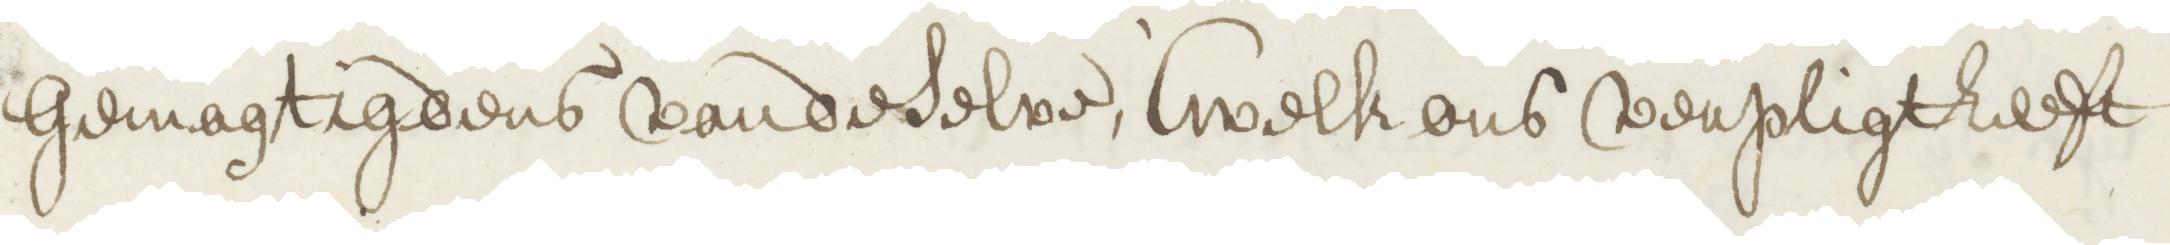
gemagtigdens van deselve, 'twelk ons verpligtheeft
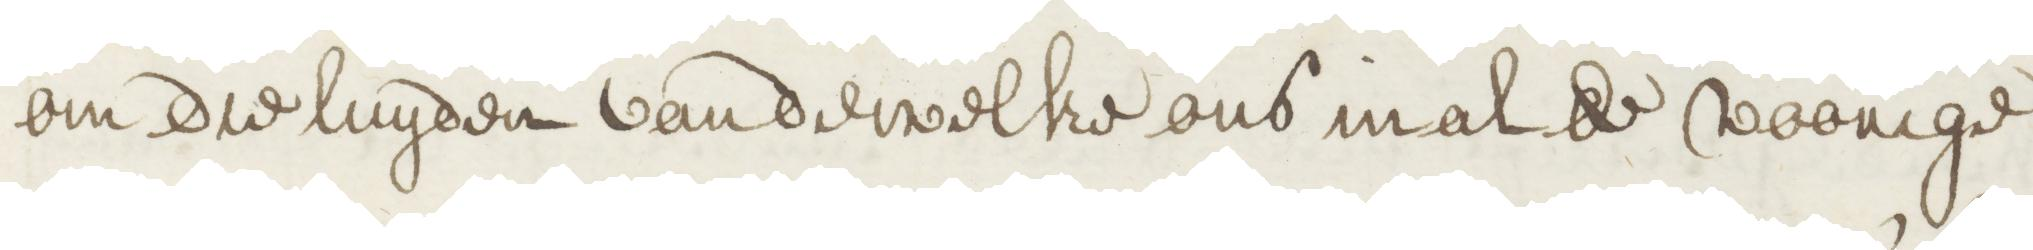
om die luijden van dewelke ons in al de voorige
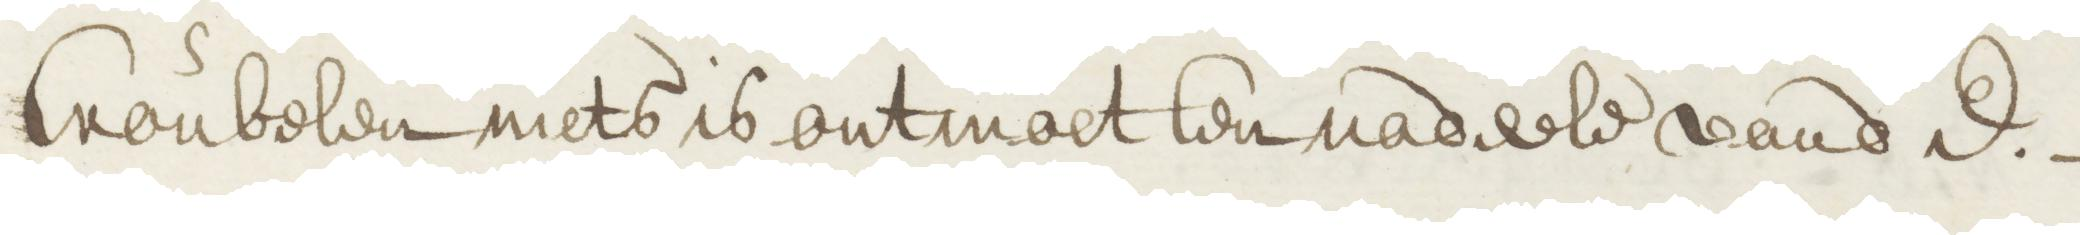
troubelen niets is ontmoet ten nadeele van d' E.
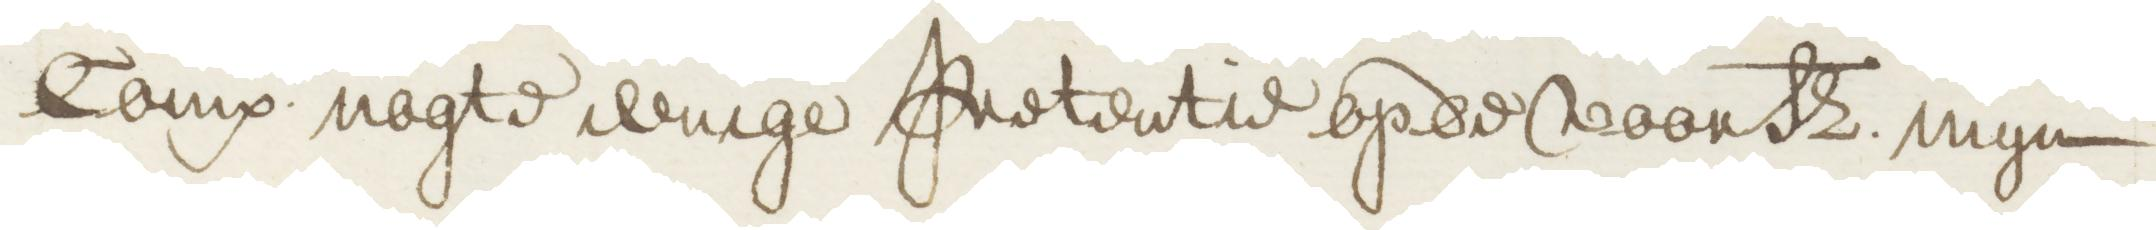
Comp:e nogte eenige Pretentie op de voorsz: mijn
